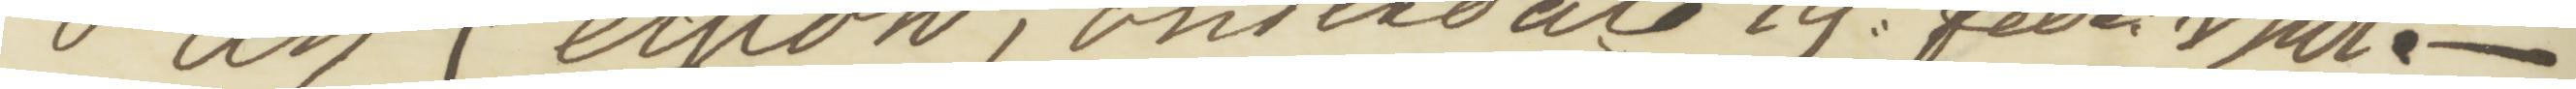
Van Ceijlon, onder dato 19:' febr: 1741.—
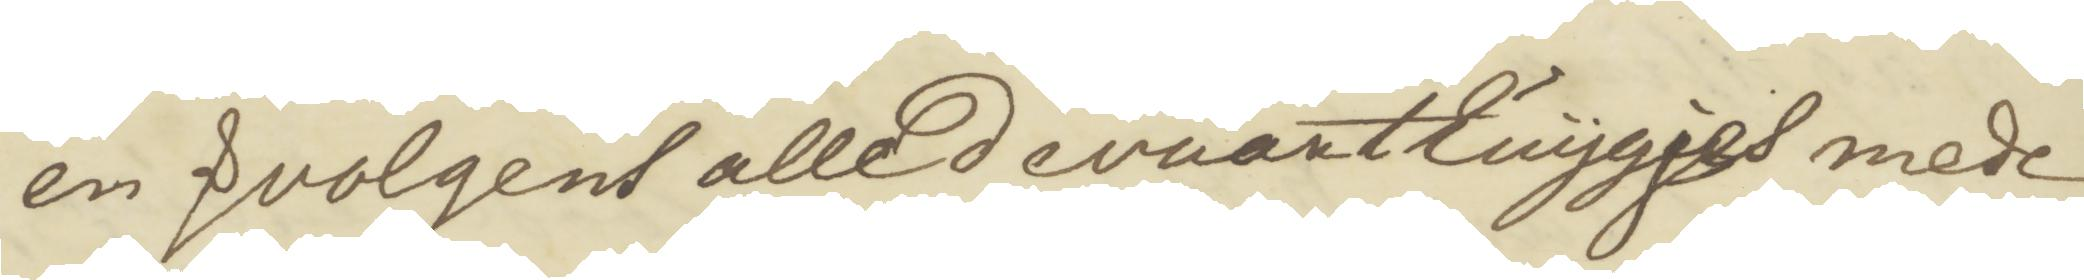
en vervolgens alle de vaarthuijgjes mede
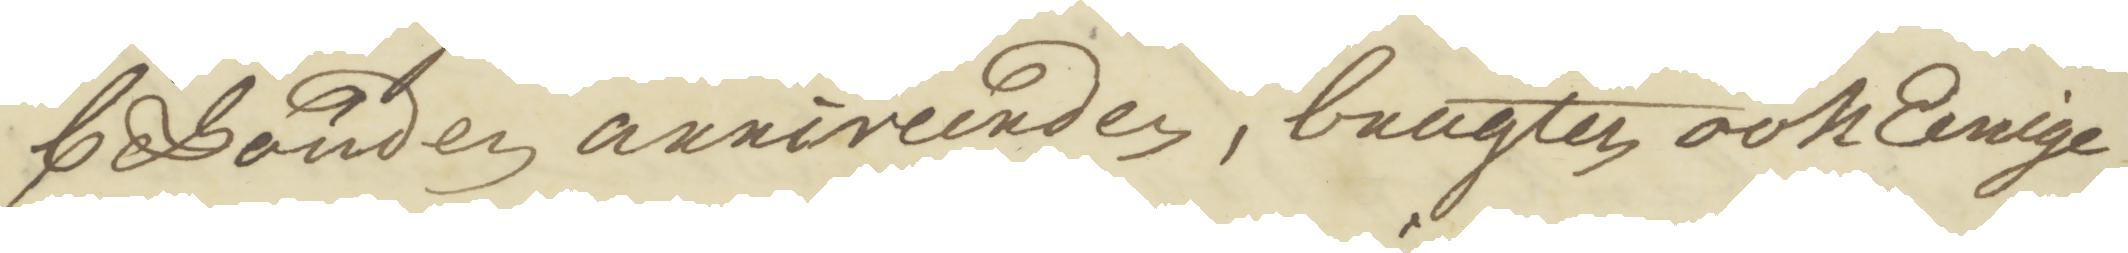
behouden arriveerden, bragten ook Eenige
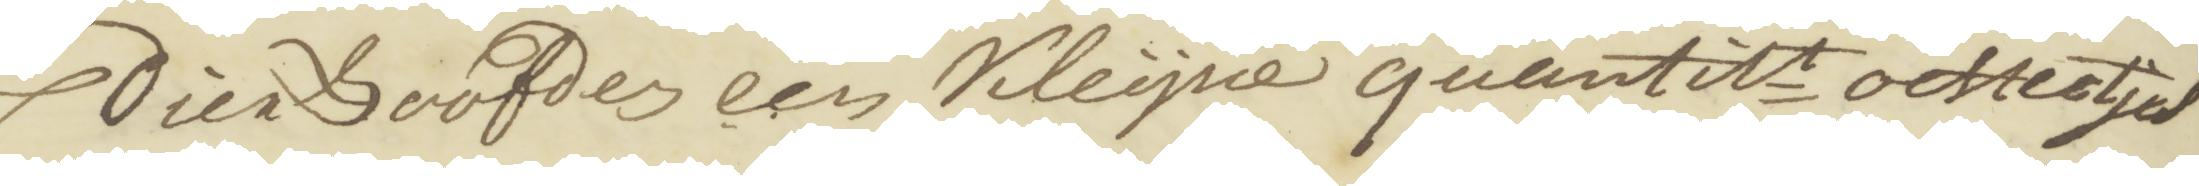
dier hoofden een kleijne quantit=t oestertjes
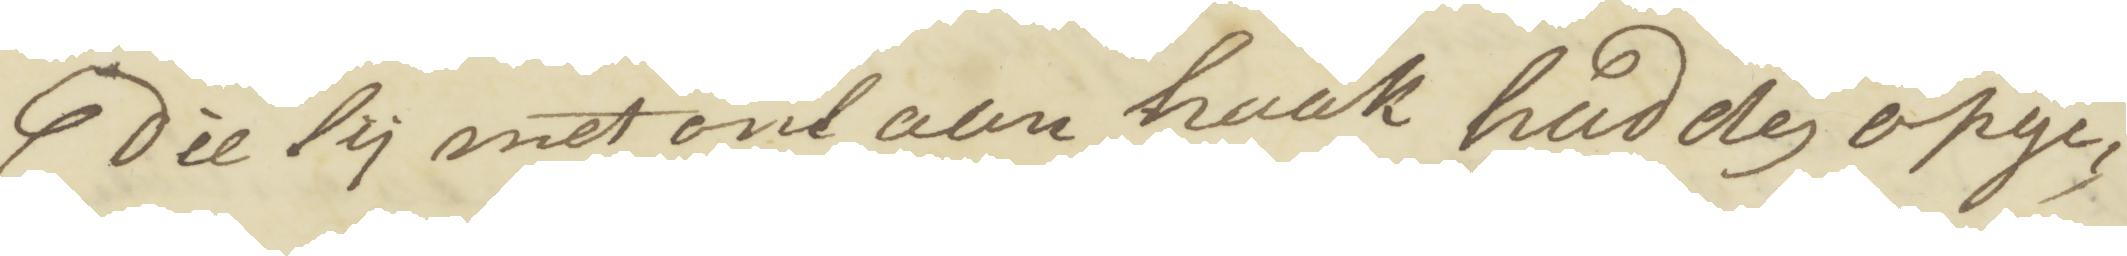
die sij met ons aan haak hadden opge„
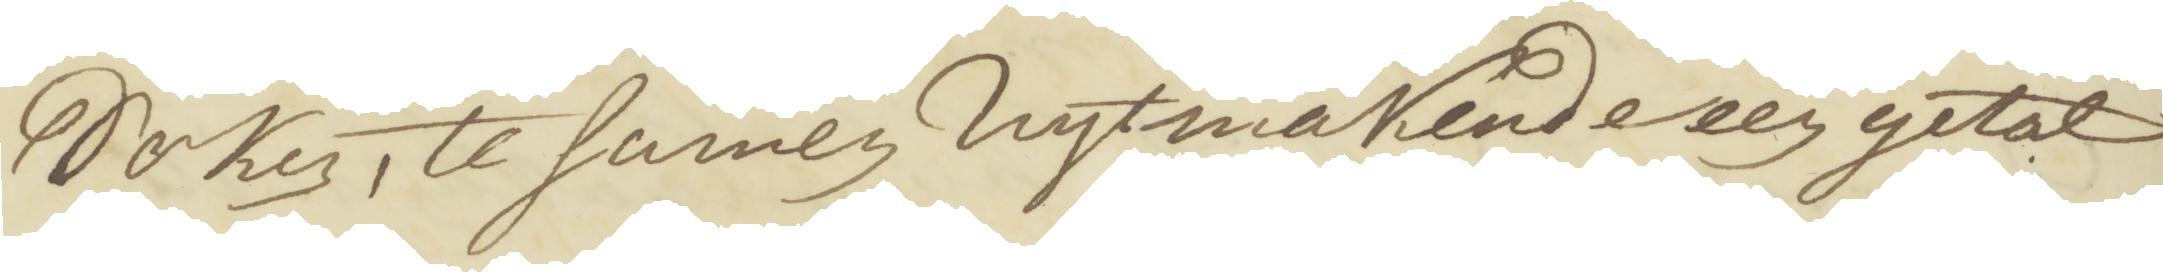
doken, te samen uytmakende een getal
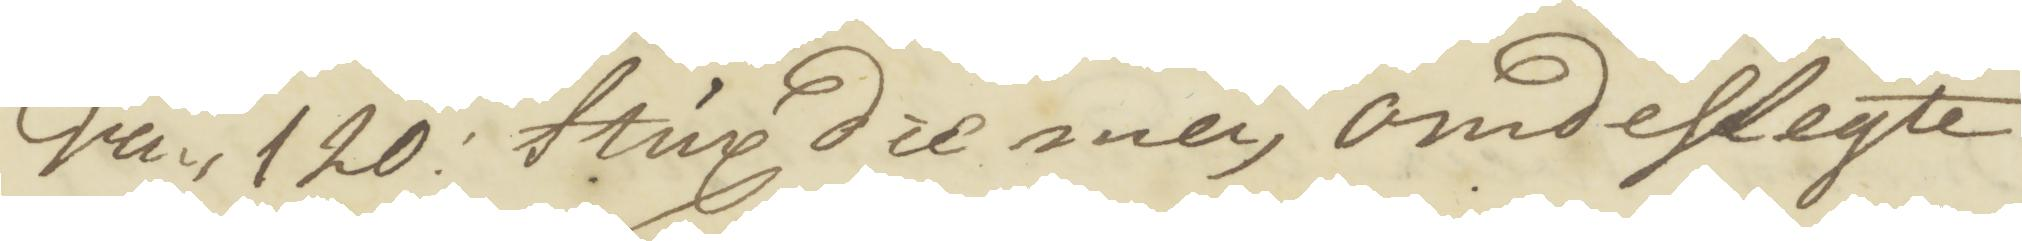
van, 120: stux die men om de slegte
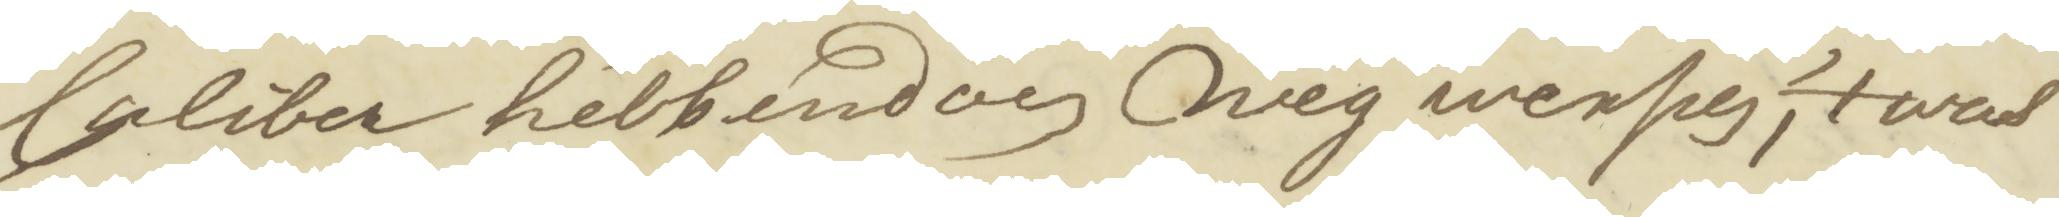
Caliber hebbendoen weg werpen, 't was
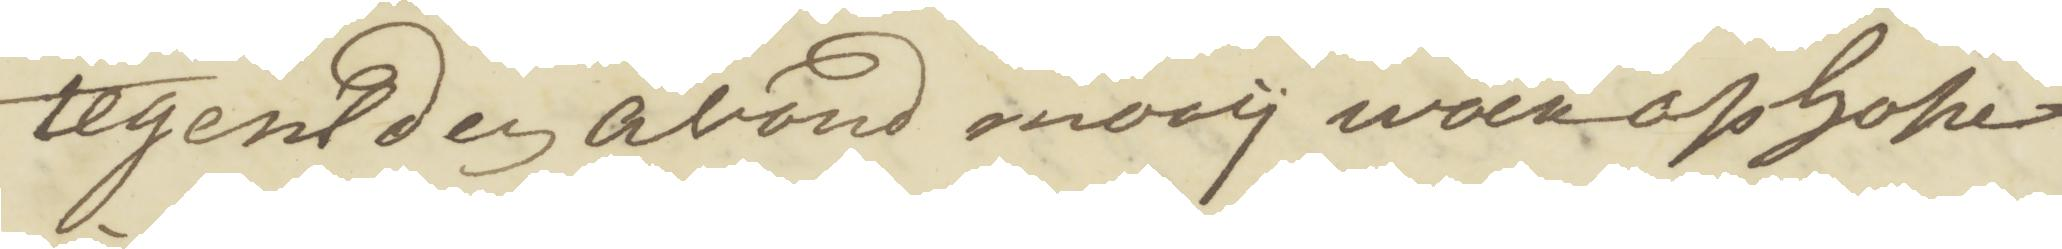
tegens den avond mooij weer op hope
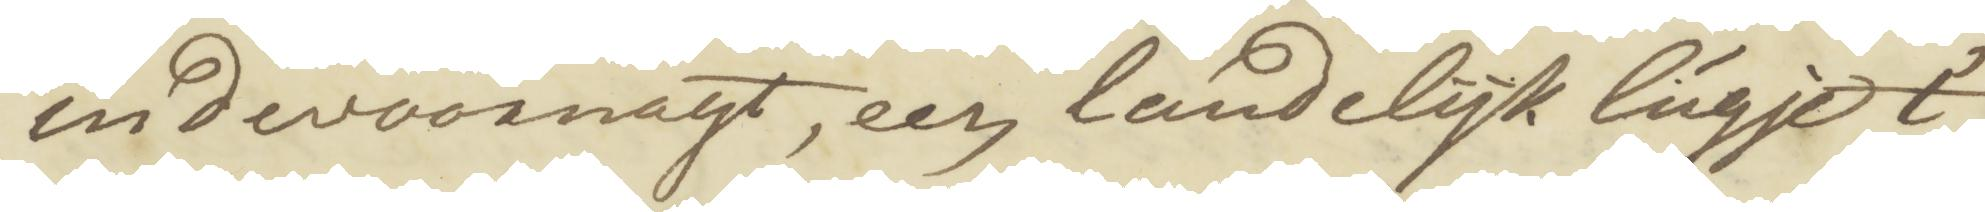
in de voornagt, een landelijk lugje t'
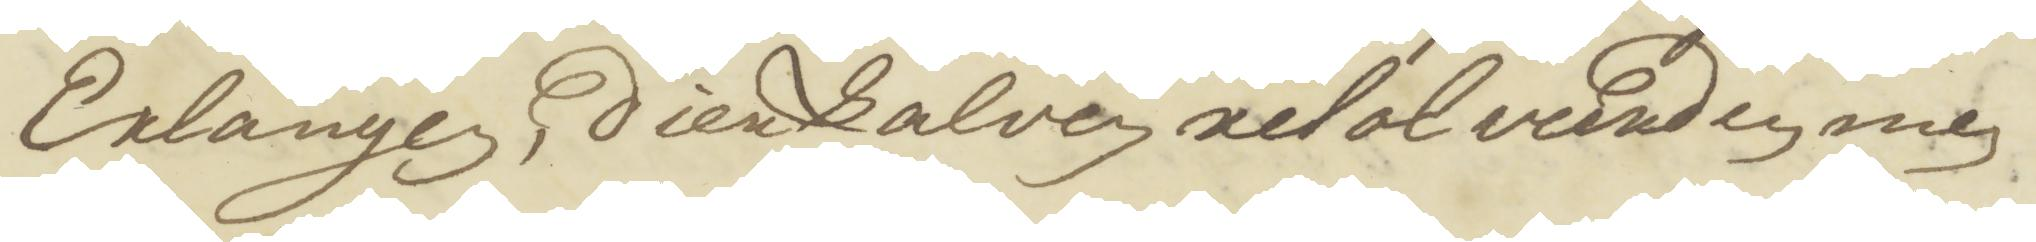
Erlangen, dierhalven resol veerden men
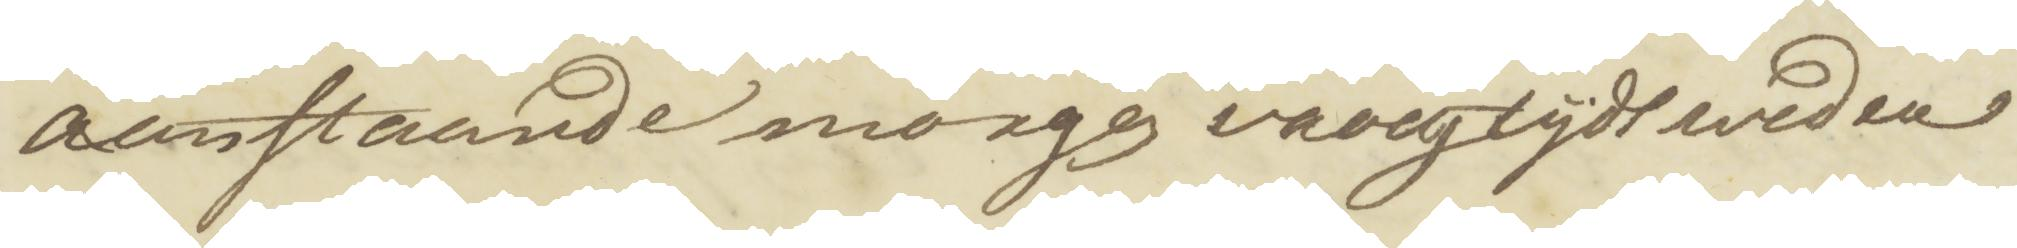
aanstaande morgen vroegtijds weder
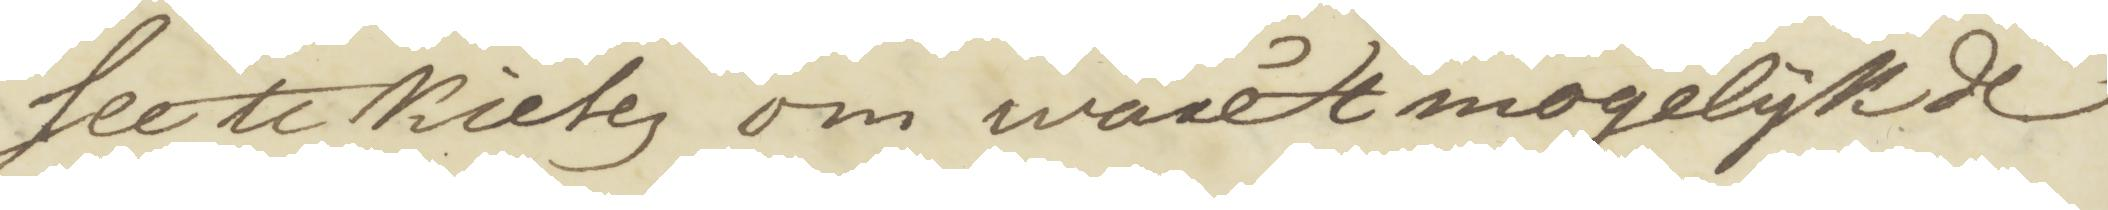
see te kiesen om ware ’t mogelijk de
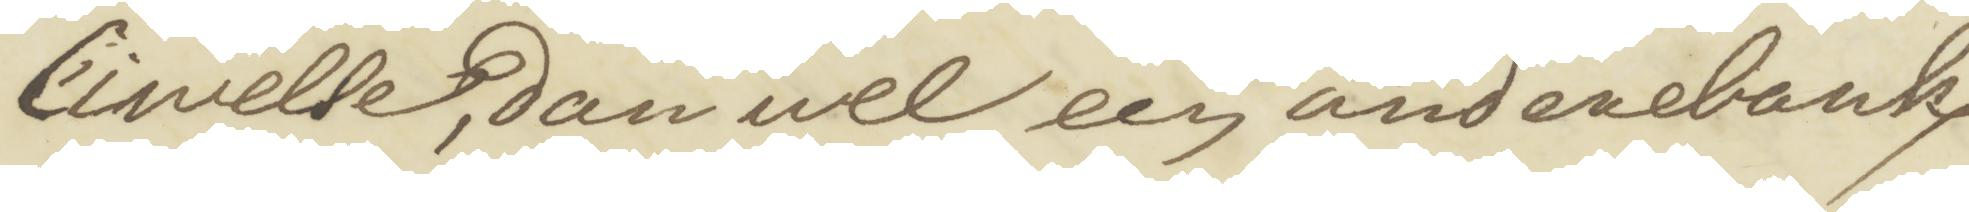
ciwelse, dan wel een anderebank
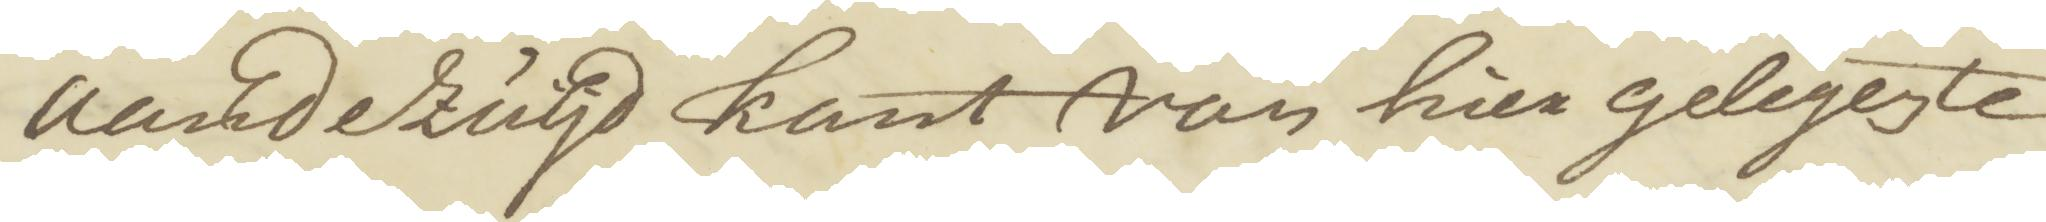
aan de zuijd kant van hier gelegen te
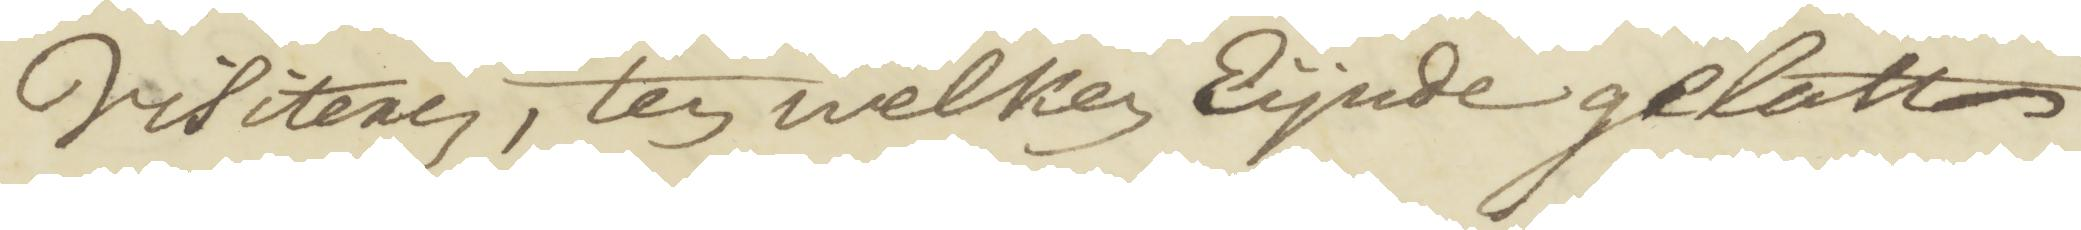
visiteren, ten welken Eijnde gelast
